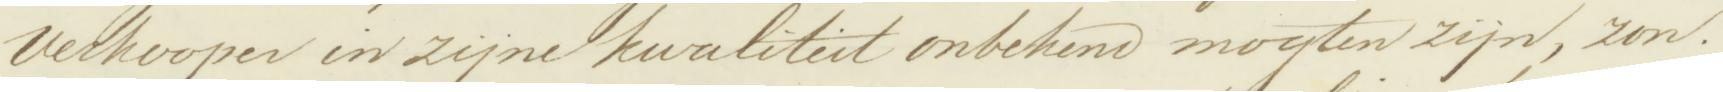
verkooper in zijne kwaliteit onbekend mogten zijn, zon.
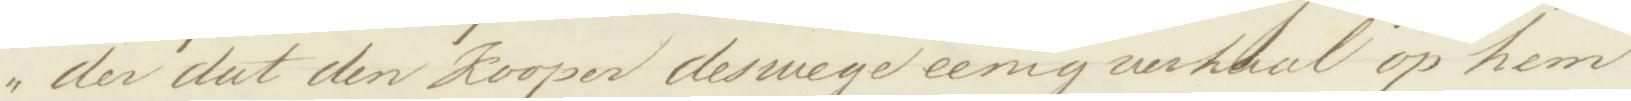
„der dat den kooper deswege eenig verhaal op hem
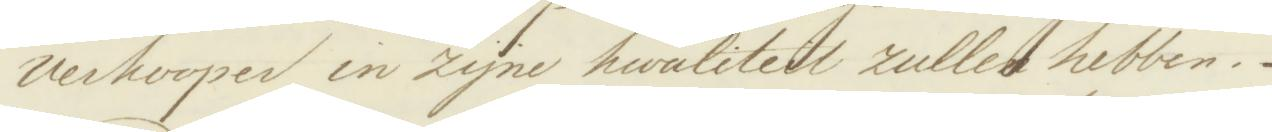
verkooper in zijne kwaliteit zullen hebben.
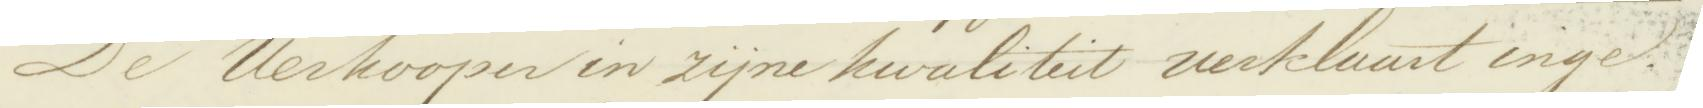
De Verkooper in zijne kwaliteit verklaart inge„
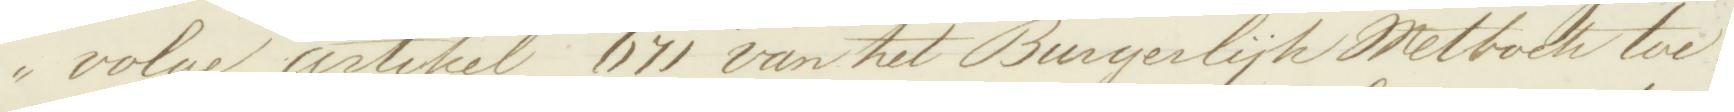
„volge artikel 671 van het Burgerlijk Wetboek toe
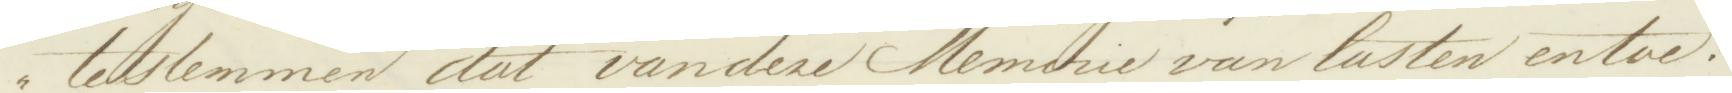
„testemmen dat van deze Memorie van lasten en toe„
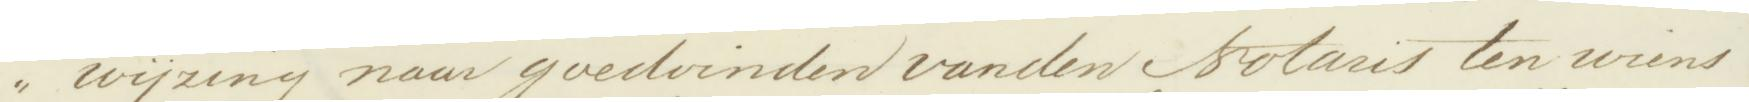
„wijzing naar goedvinden vanden Notaris ten wiens
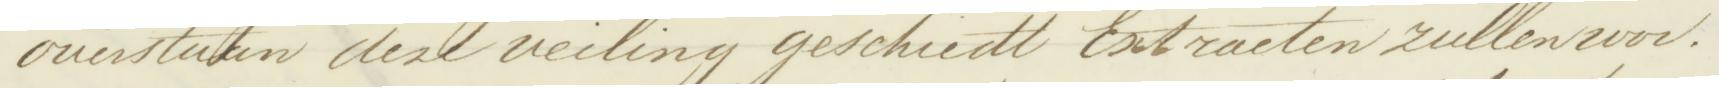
overstaan deze veiling geschiedt Extracten zullen wor„
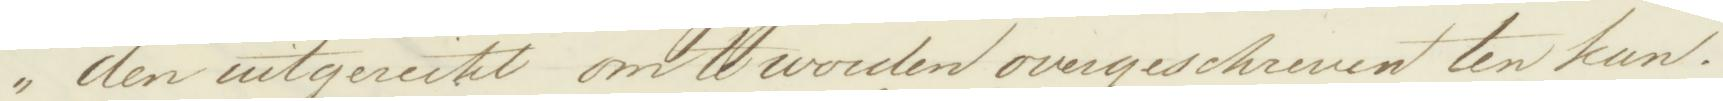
„den uitgereikt om te worden overgeschreven ten kan„
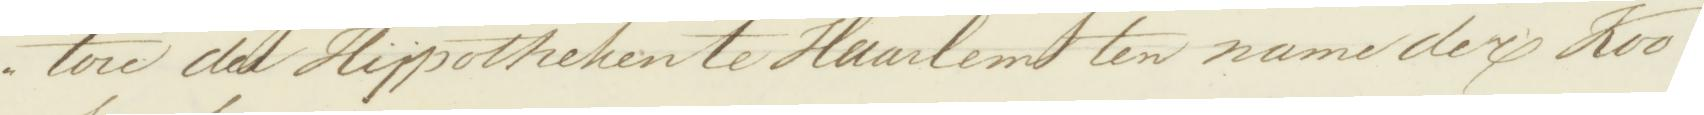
„tore der Hijpotheken te Haarlem ten name der Koo
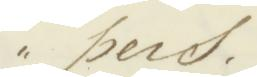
„pers.
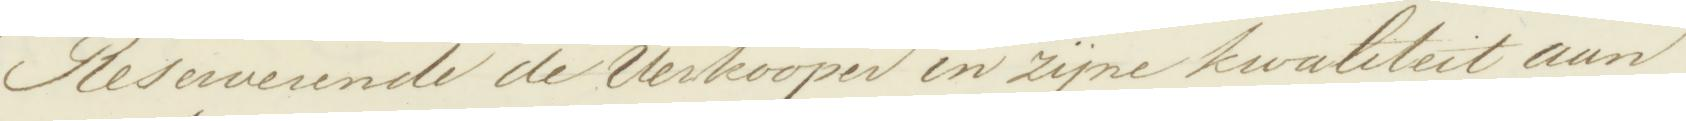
Reserverende de Verkooper in zijne kwaliteit aan
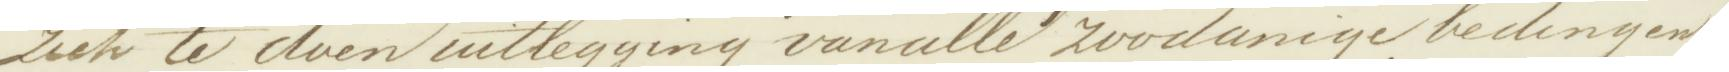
zich te doen uitlegging van alle zoodanige bedingen
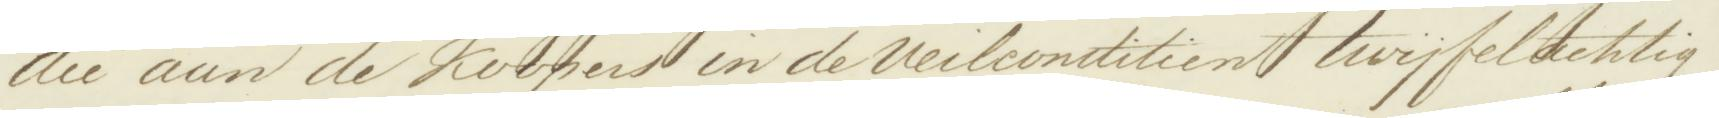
die aan de Koopers in de veilconditien twijfelachtig
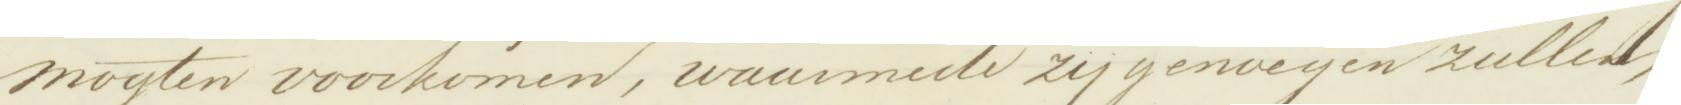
mogten voorkomen, waarmede zij genoegen zullen
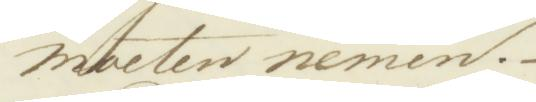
moeten nemen.
